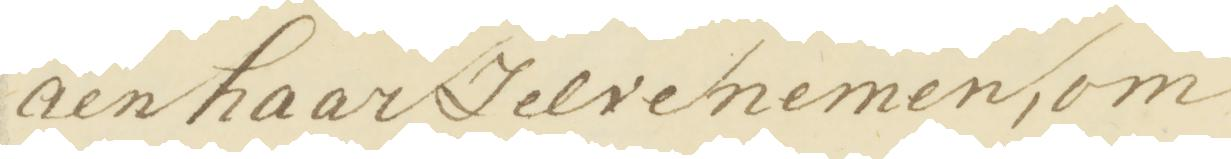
aen haar Zelve nemen, om
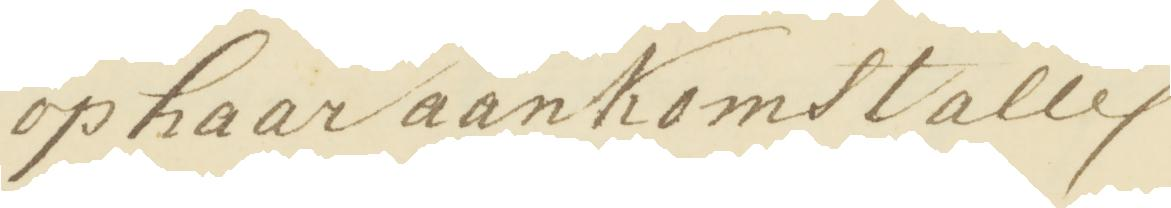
op haar aankomst alle
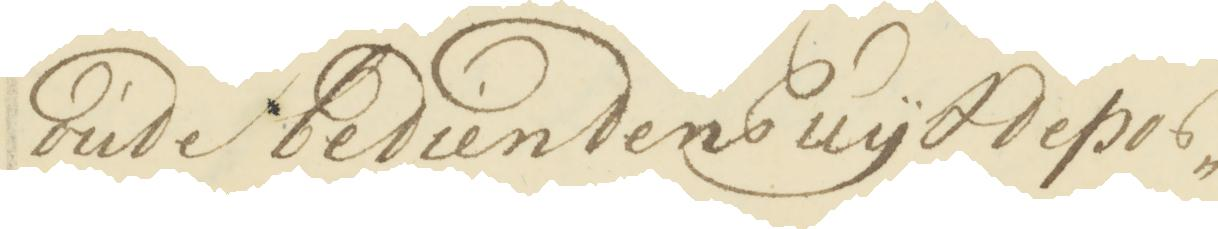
oude bediendens uijt de pos
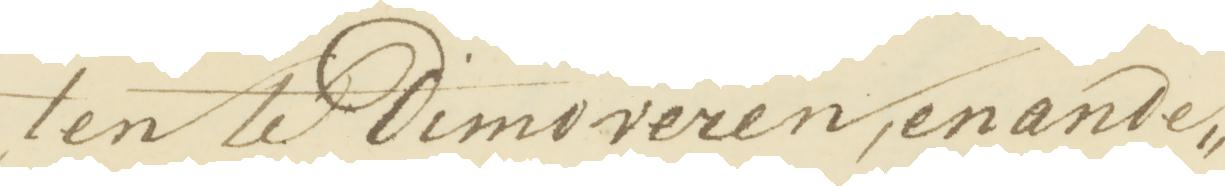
ten te dimoveren, en ande„
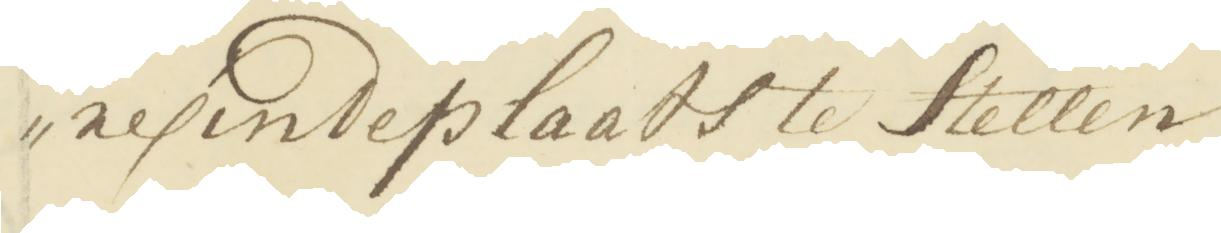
„re inde plaats te Stellen
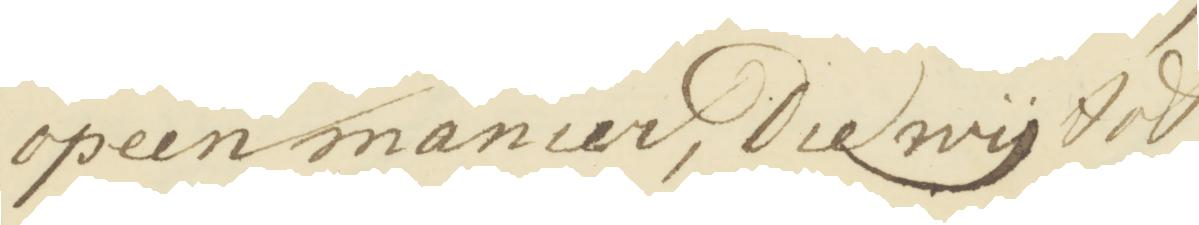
op een manier, Die wij tot
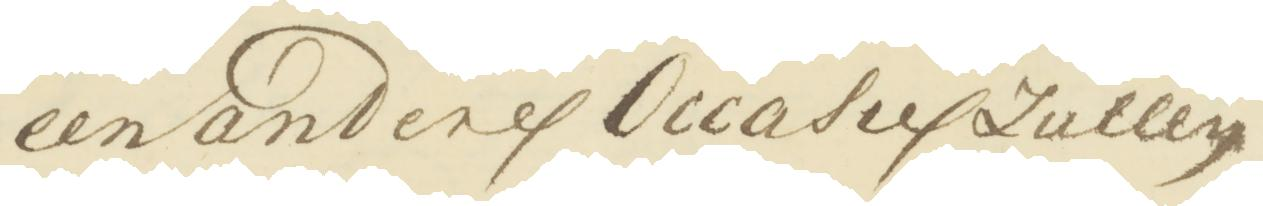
een andere Occasie zullen
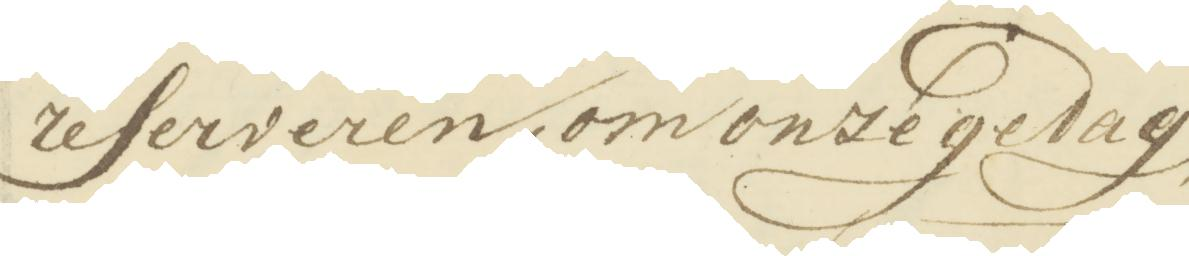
reserveren om onze gedag
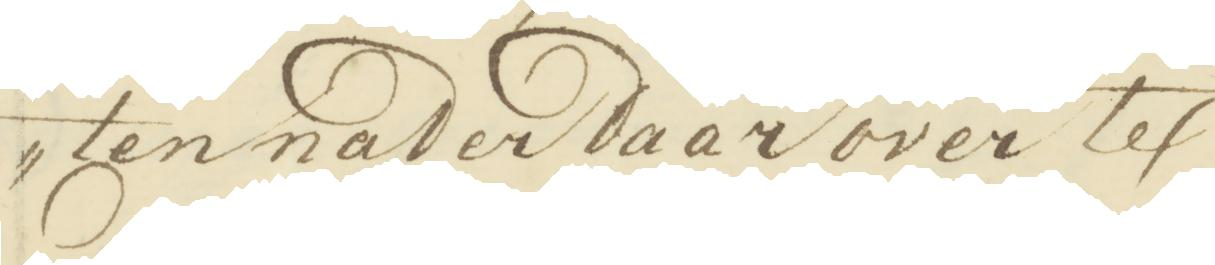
„ten nader daar over te
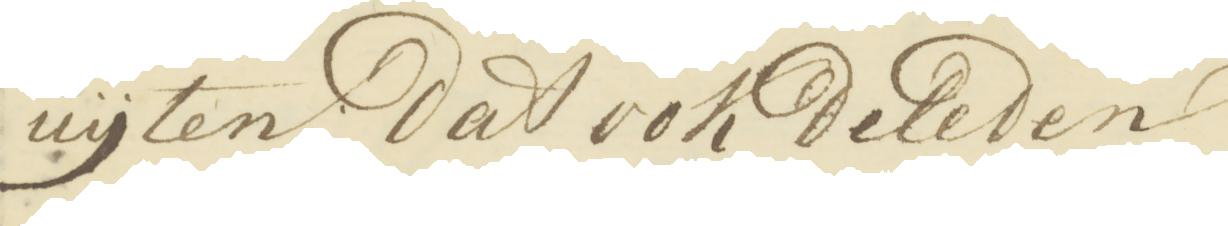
uijten; dat ook de leden
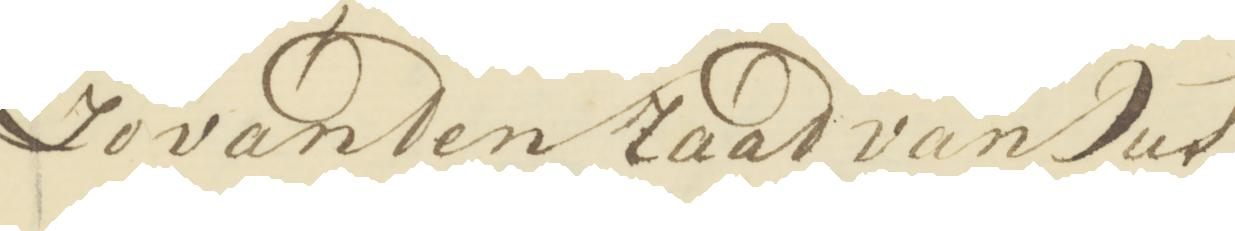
Zo van den raad van Ius
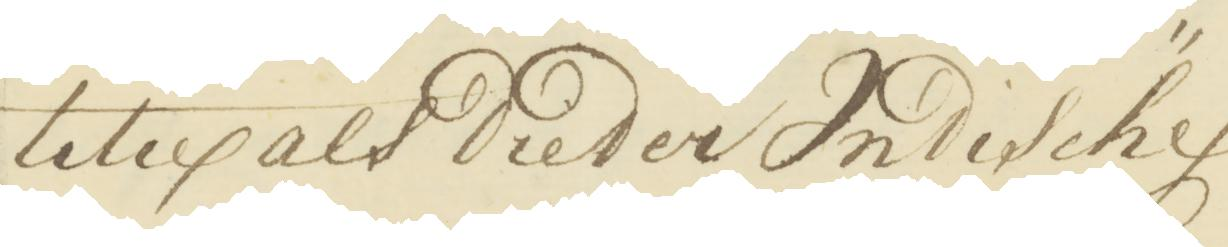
titie als die der Indische
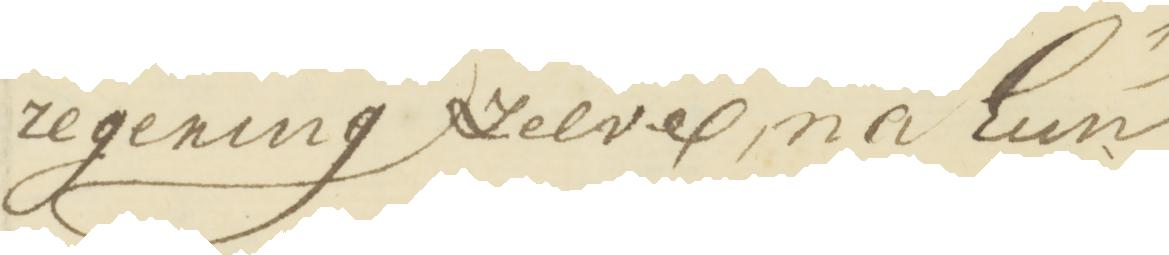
regering zelve, na hun
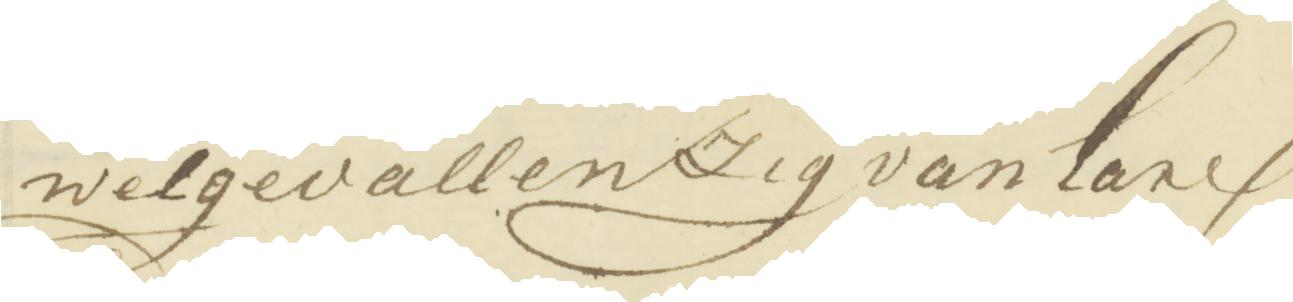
welgevallen zig van hare
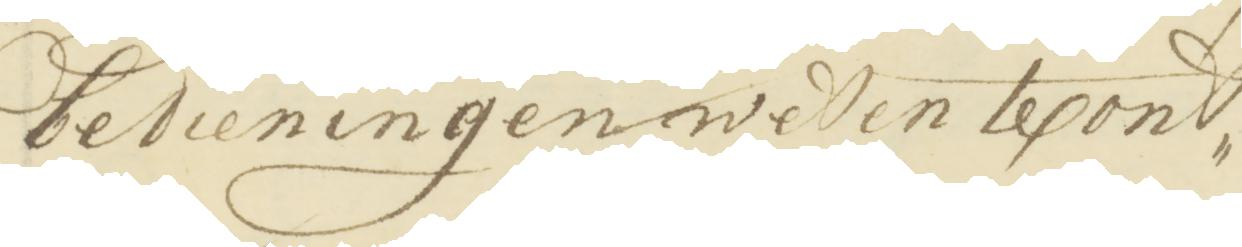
bedieningen weten te ont„
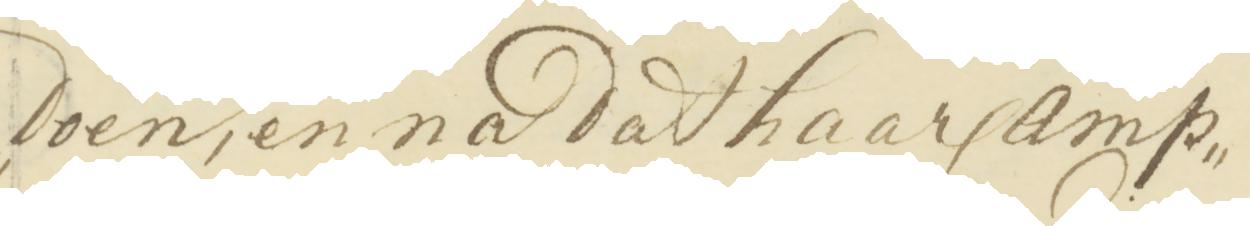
doen, en na dat haar amp„
